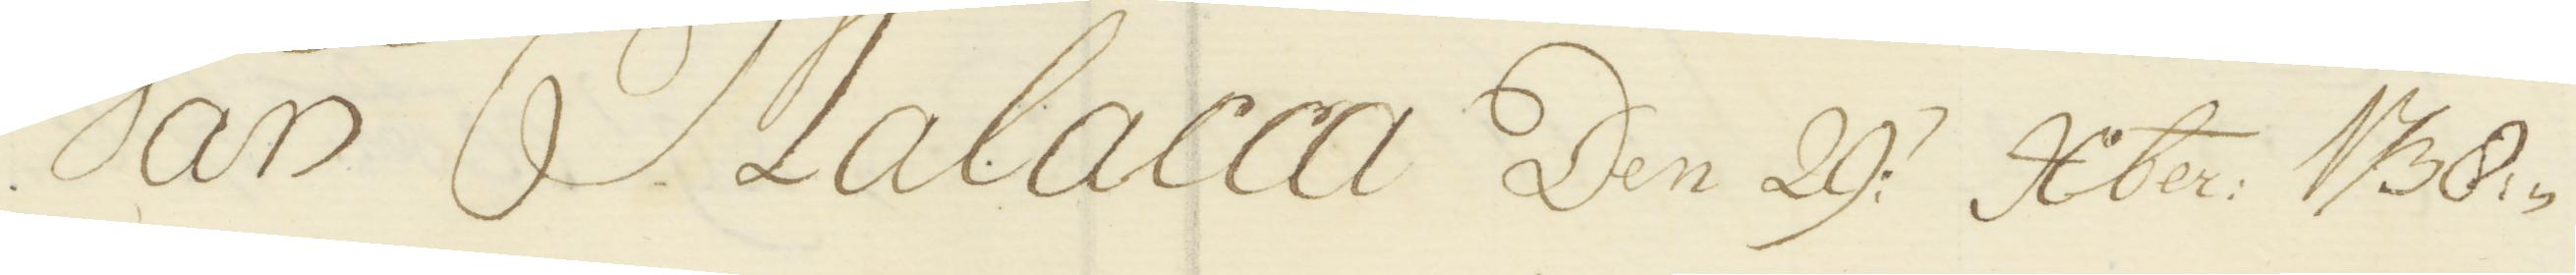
Van Malacca Den 29:' Xber: 1738:„
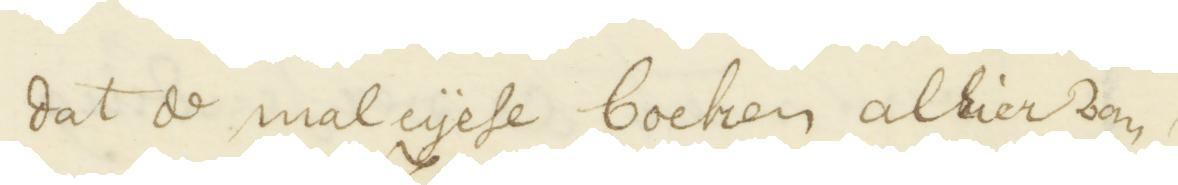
dat de maleijese boeken alhier van
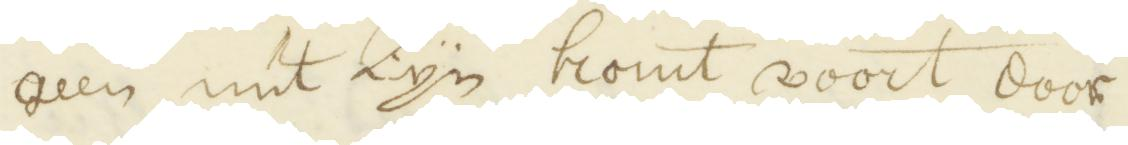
geen nut zijn komt voort door
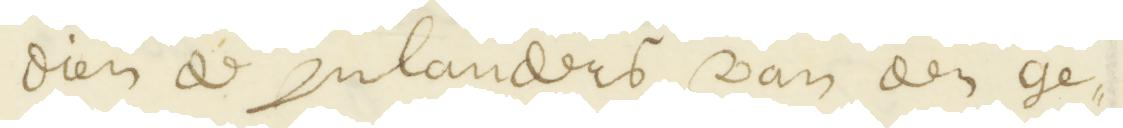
dien de jnlanders van den ge„
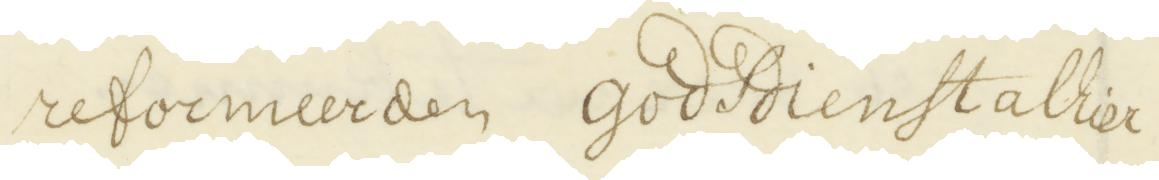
reformeerden godsdienst alhier
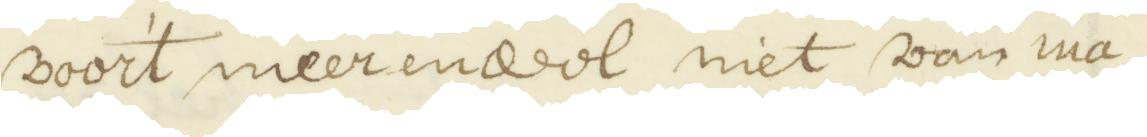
voor't meerendeel niet van ma
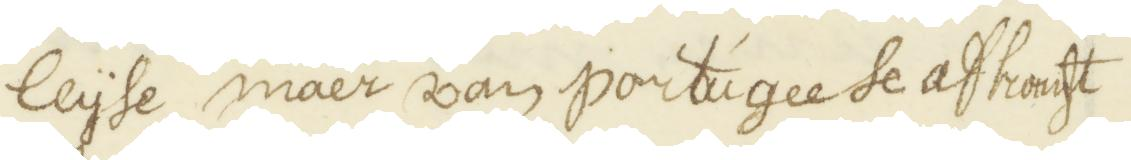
leijse maer van portugeese afkomst
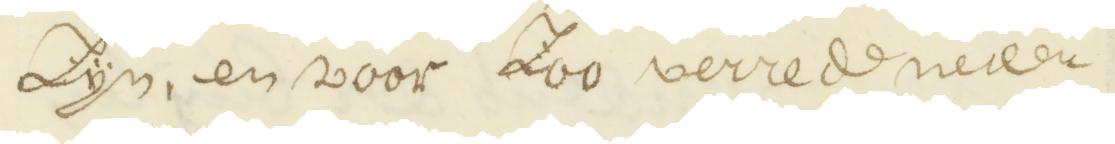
zijn, en voor zoo verre de neder
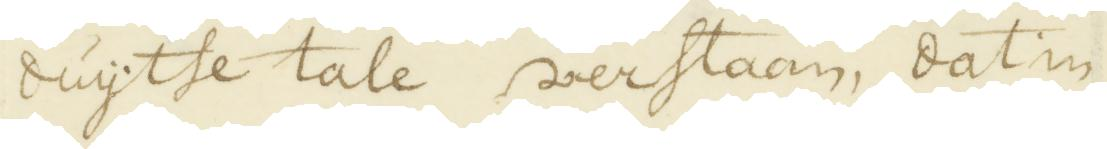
duijtse tale verstaan, dat in
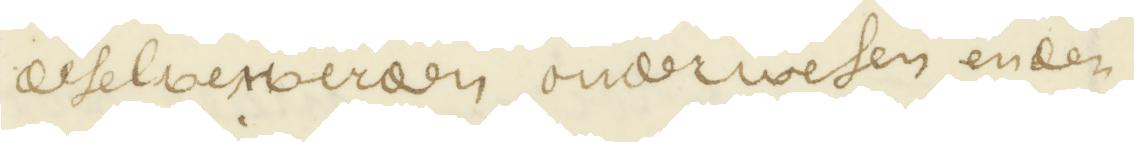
deselve werden onderwesen en den
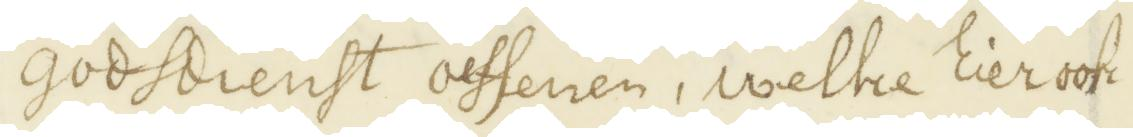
godsdienst oeffenen, welke hier ook
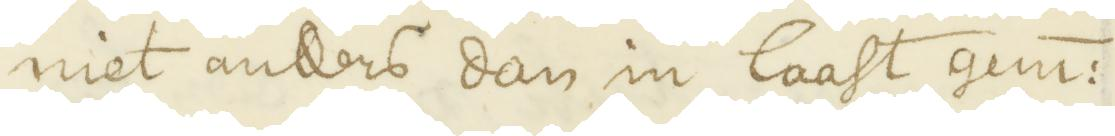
niet anders dan in laast gem:
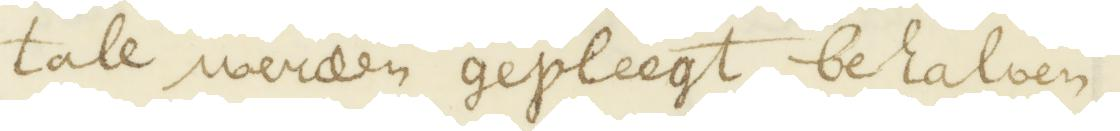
tale werden gepleegt, behalven
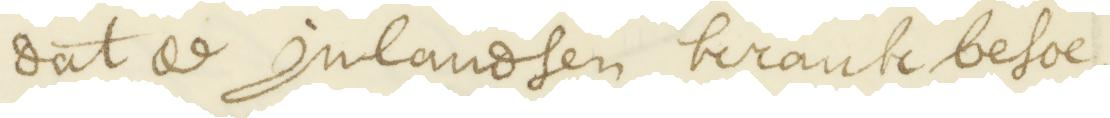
dat de jnlandsen krank besoe
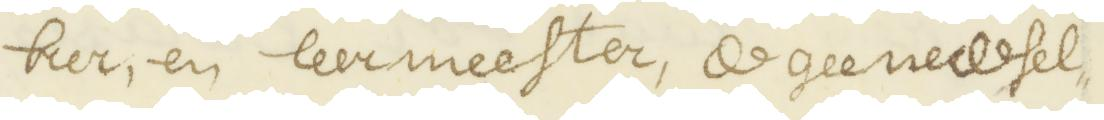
ker, en leermeester, de geenedesel„
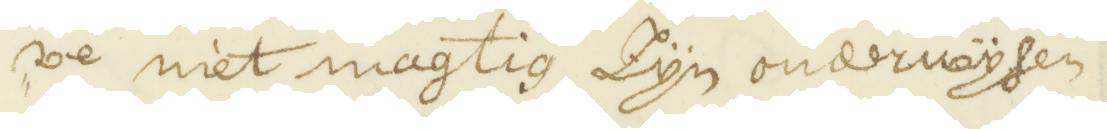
ve niet magtig zijn onderwijsen
